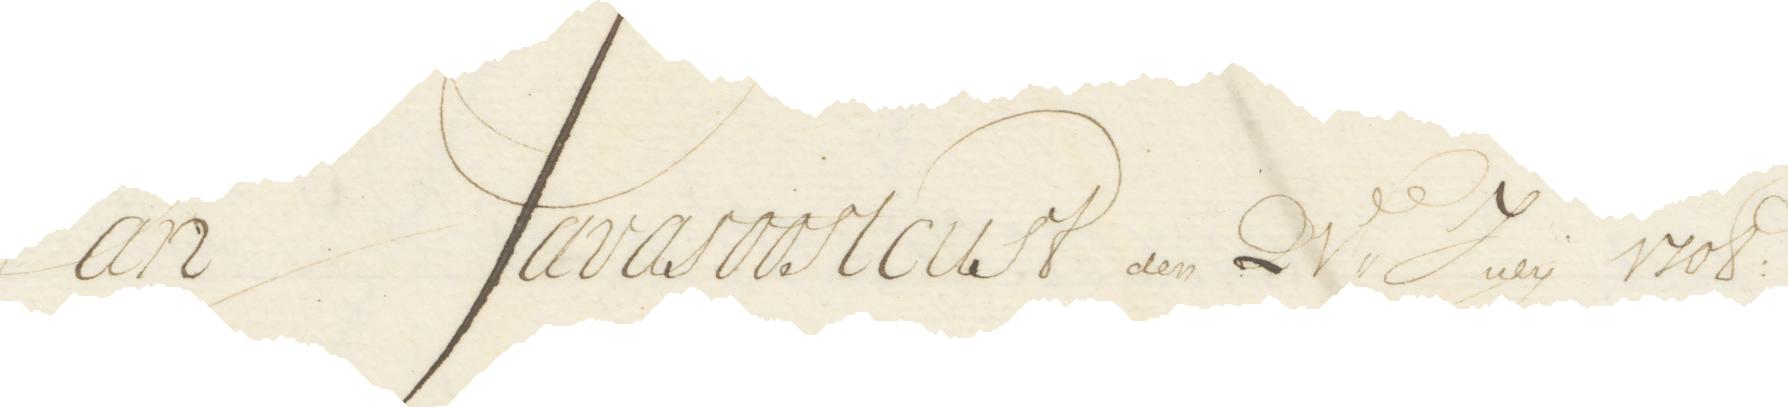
Van Javasoost cust den 21„en Iulij 1708:
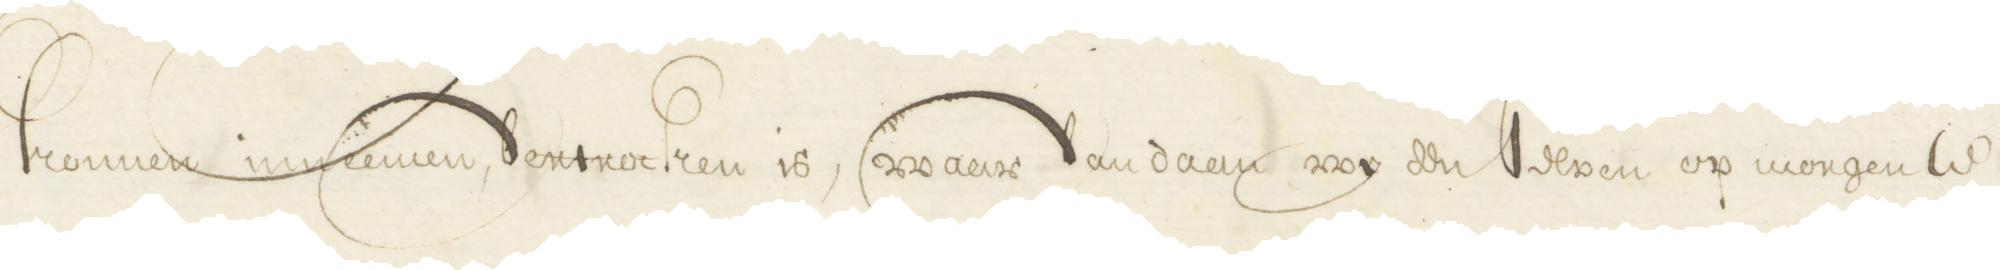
konnen inneemen, vertrocken is, waar van daar wij den selven op morgen te
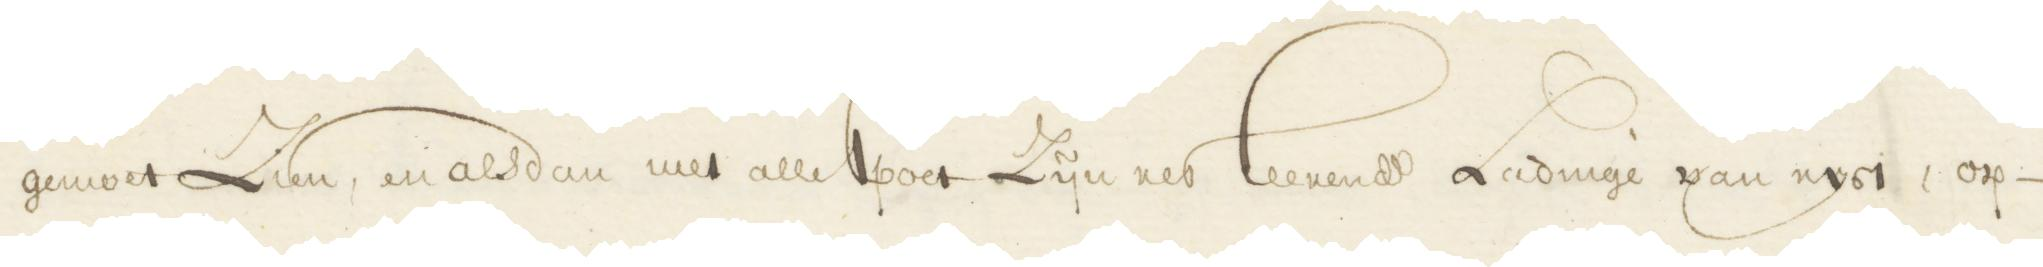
gemoet zien, en als dan met alle spoet zijn resteerende ladinge van rijst, op
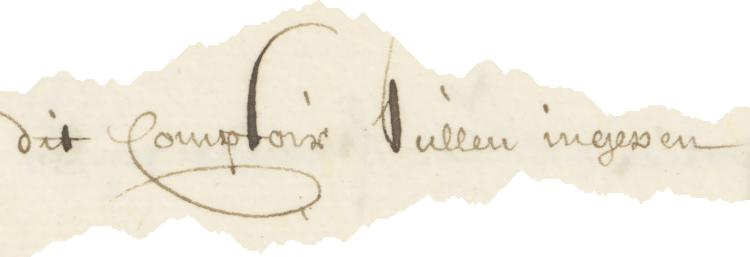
dit comptoir sullen ingeven
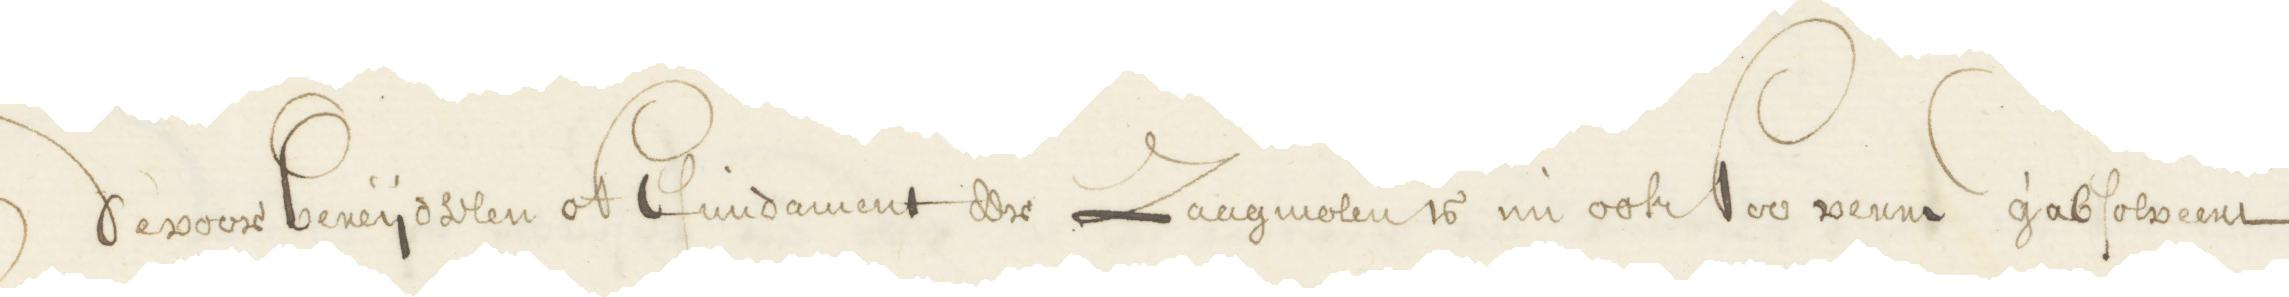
devoor bereijdselen of tfundament der Zaagmolen is nu ook soo verre g'absolveert
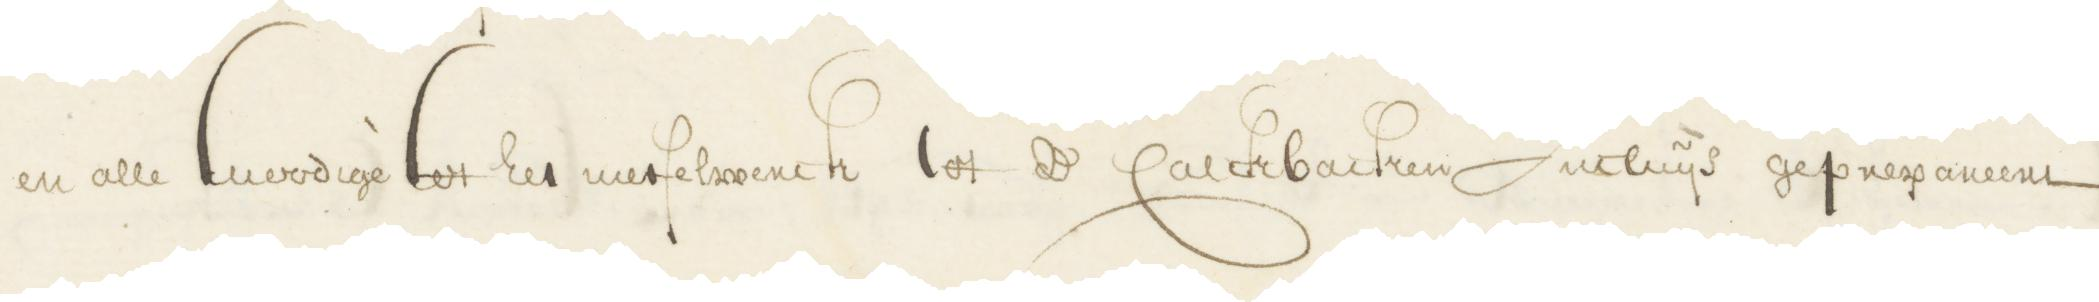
en alle tnoodige tot het metselwerck tot de Calckbacken Jncluijs geprepareert
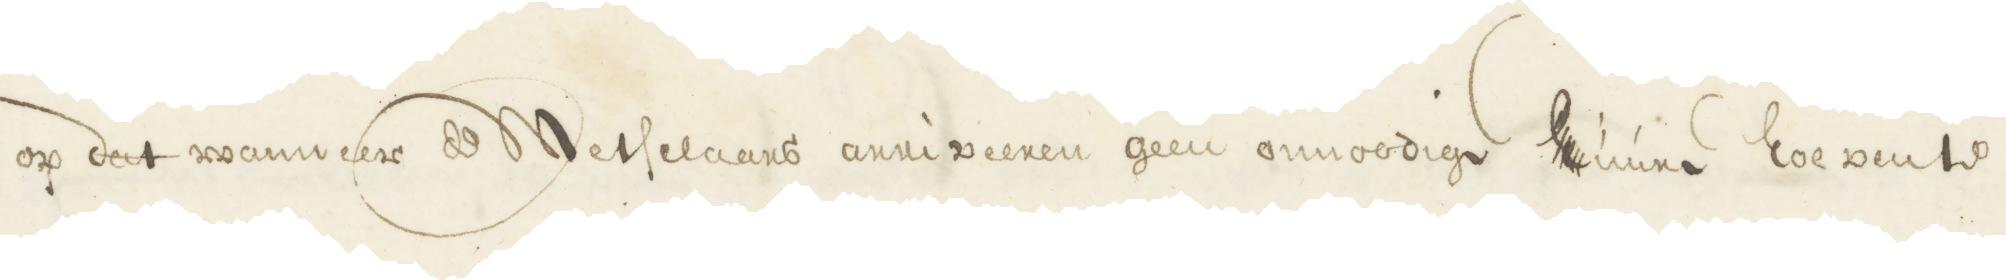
op dat wanneer de Metselaars arriveeren geen onnoodige uure hoeven te
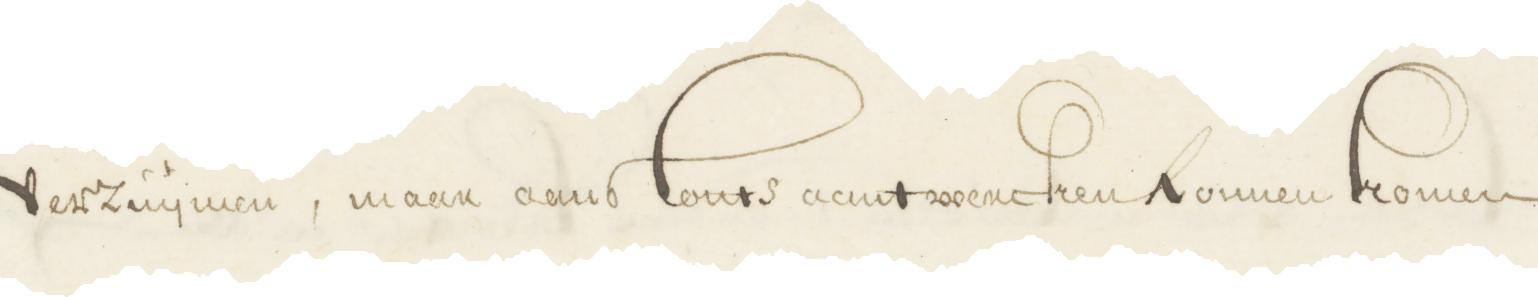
verzuijmen, maar aanstonts aant wercken konnen komen
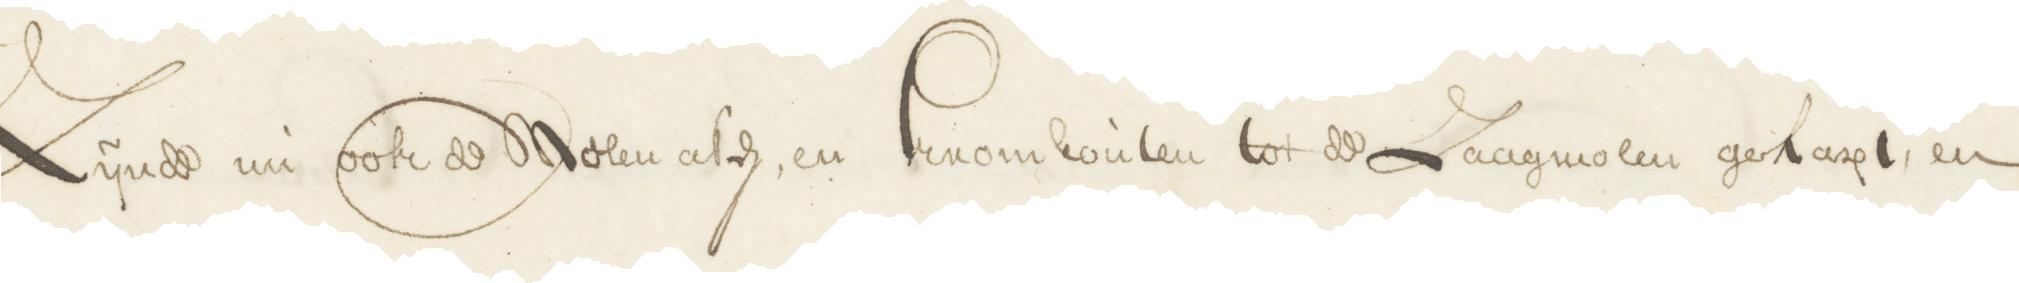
Zijnde nu ook de Molen asen, en kromhouten tot de Zaagmolen gekapt, en
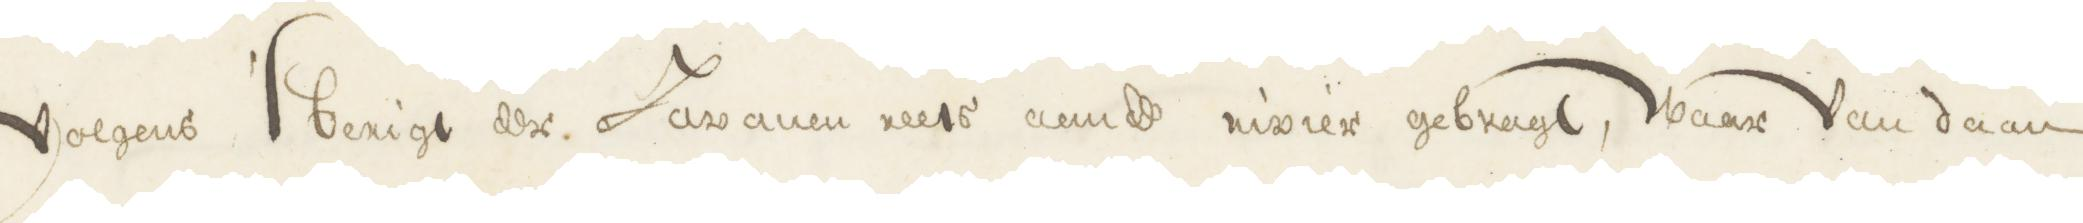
volgens 't berigt der Iavanen reets aande rivier gebragt, waar van daan
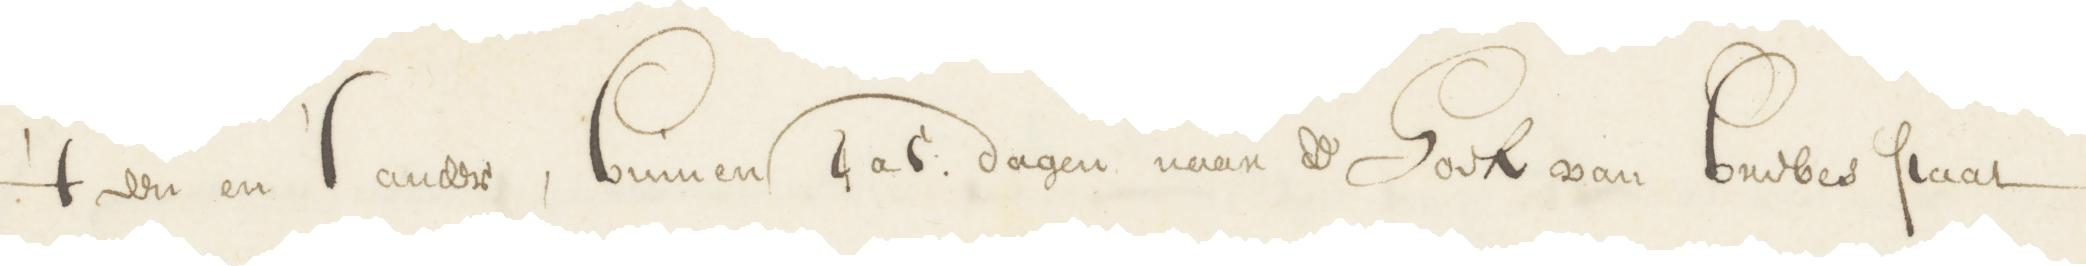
't een en ’t ander, binnen 4 a 5: dagen naar de Hoek van brebes staat
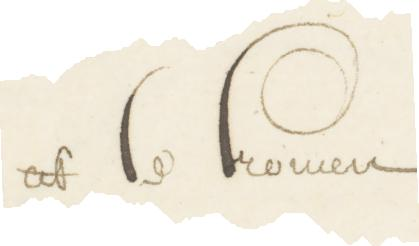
af te komen
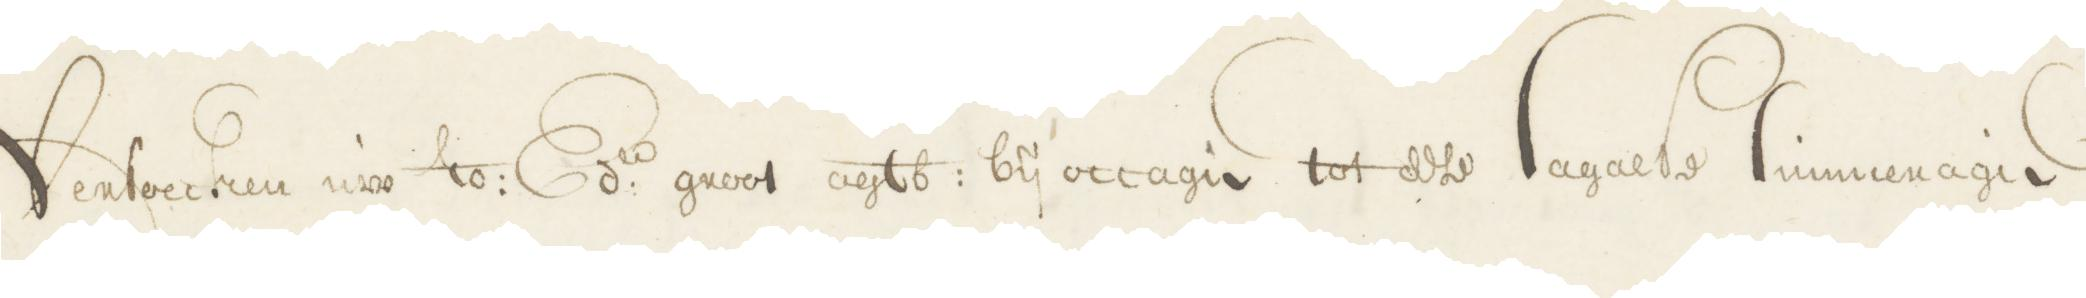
Versoeken uw ho: Ed:le groot agtb: bij occagie tot dese tagalse timmeragie
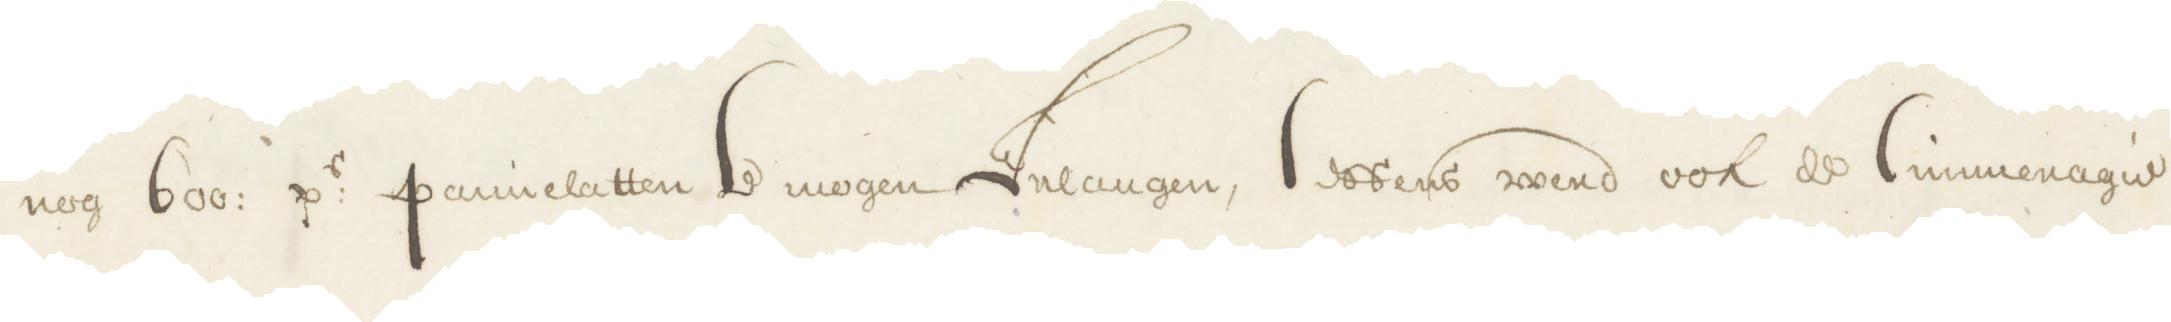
nog 600: p:s pannelatten te mogen Erlangen, teffens werd ook de timmeragie
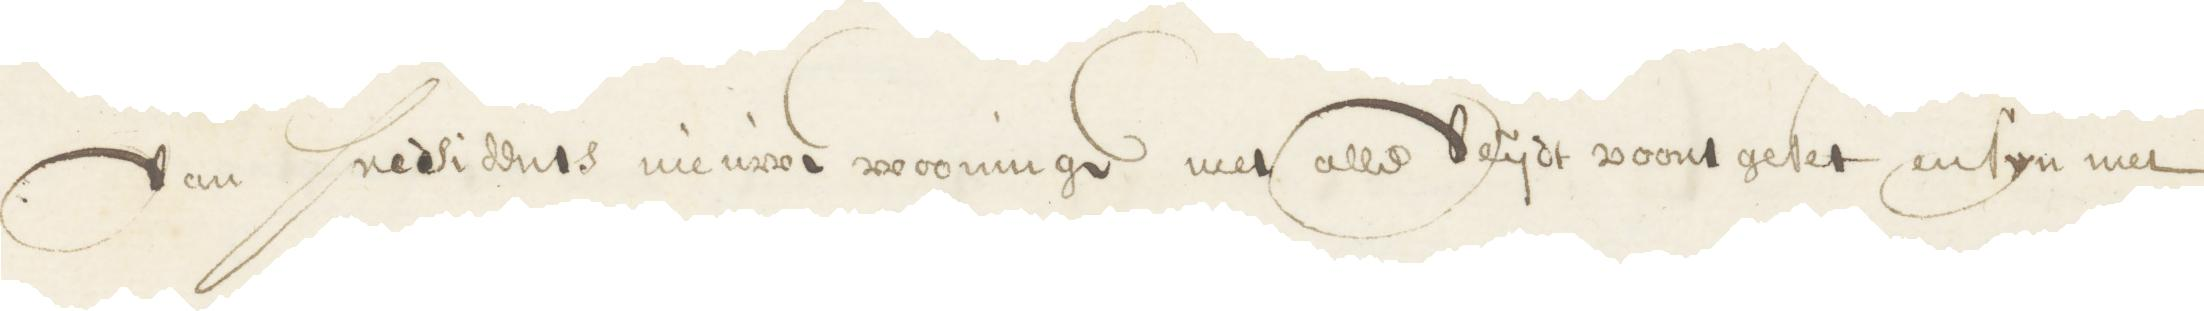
van sresidents nieuwe wooninge met alle vlijdt voort geset en syn met
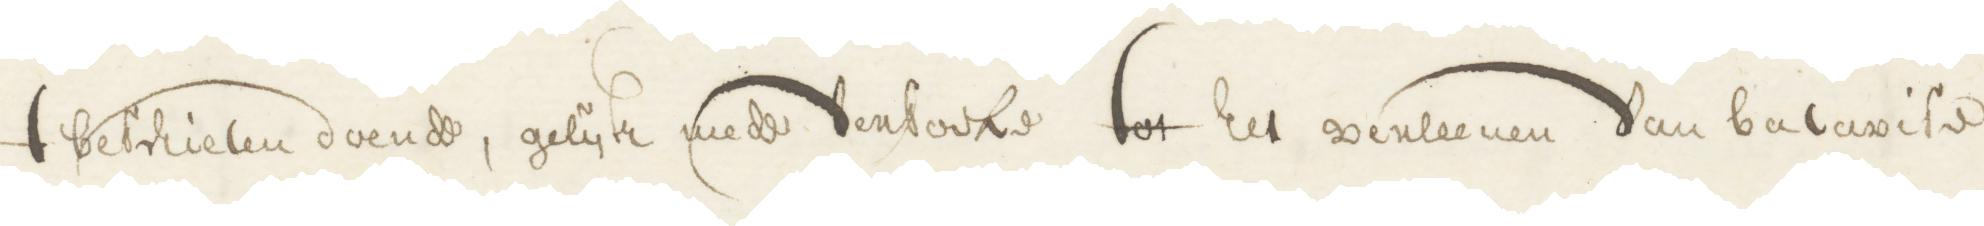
t beschieten doende, gelijk mede versoeke tot het verleenen van batavise
